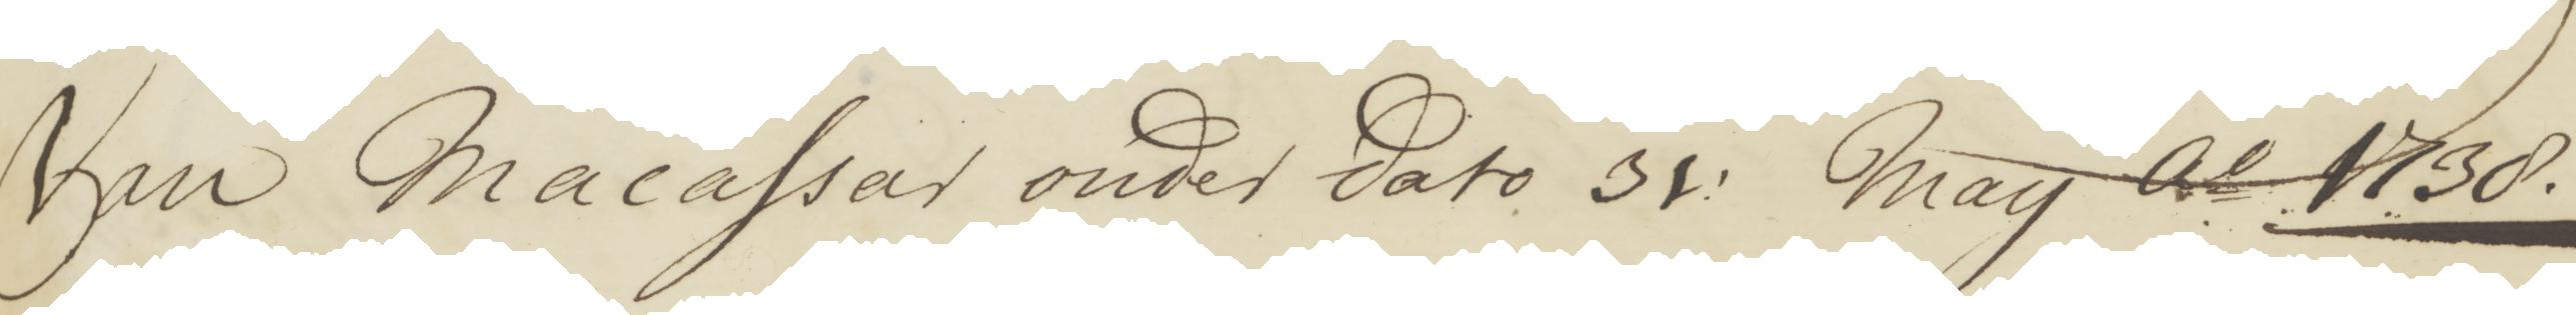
Van Macassar onder dato 31:' Maij A=o 1738.
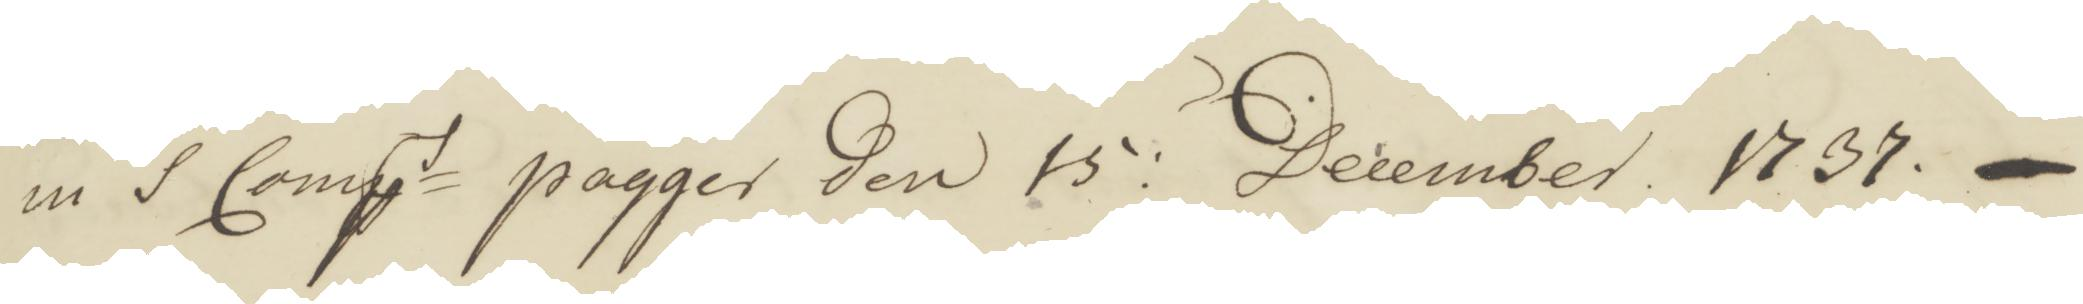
in 's Comp=s pagger den 15:' December 1737. —
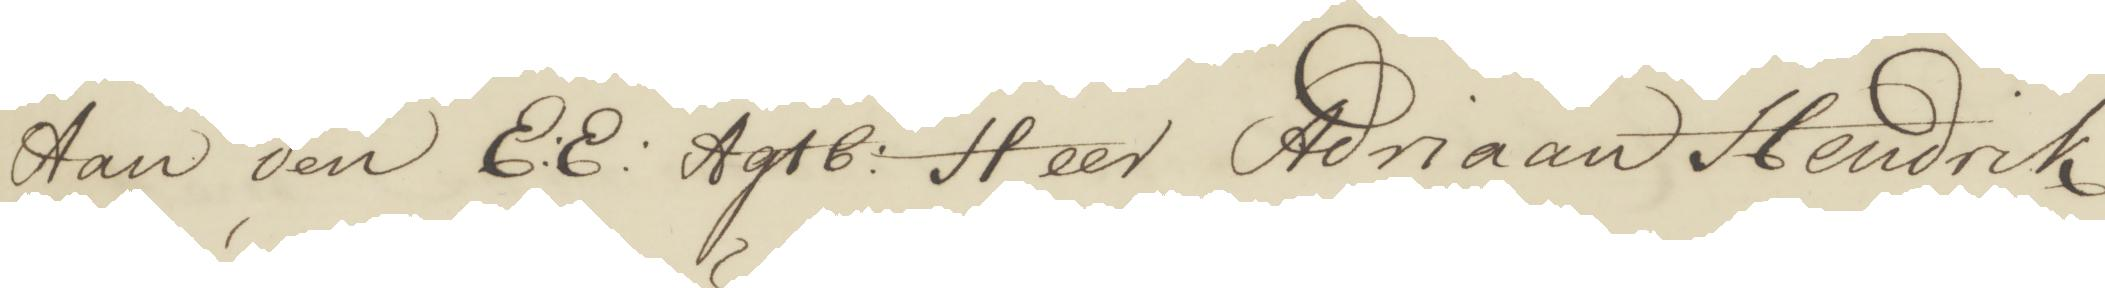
Aan den E: E: Agtb: Heer Adriaan Hendrik
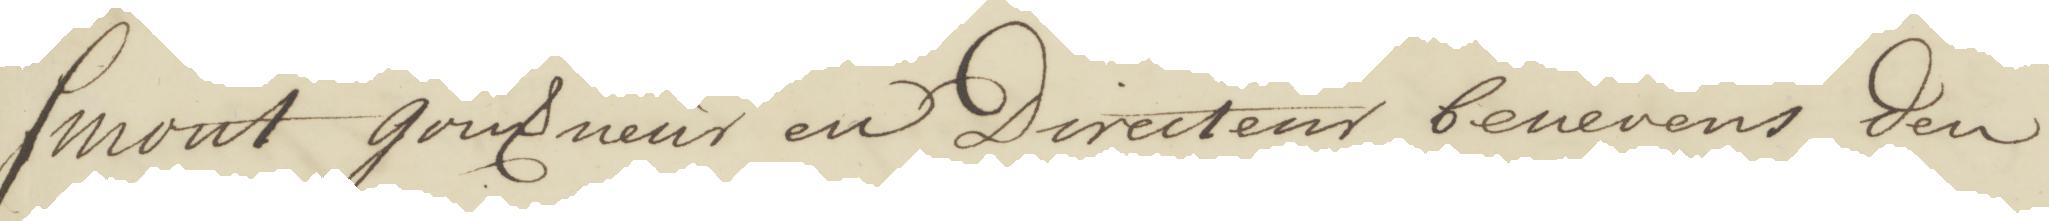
smout gouverneur en Directeur benevens den
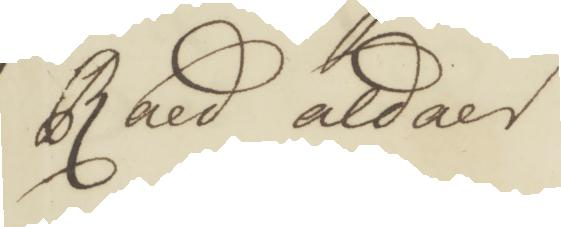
Raed aldaer
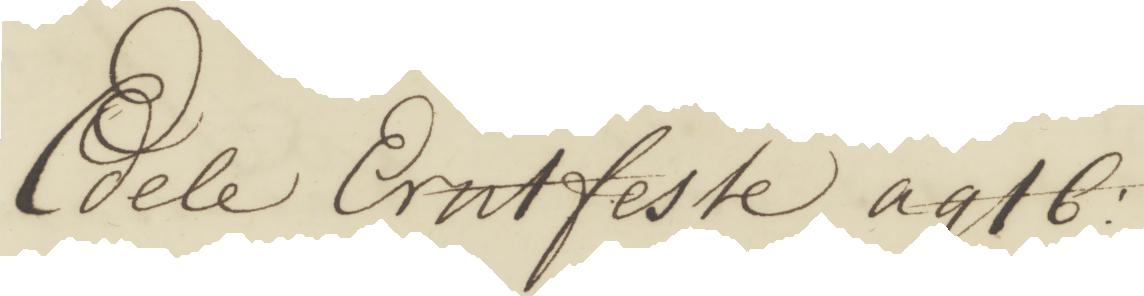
Edele Erntfeste agtb:
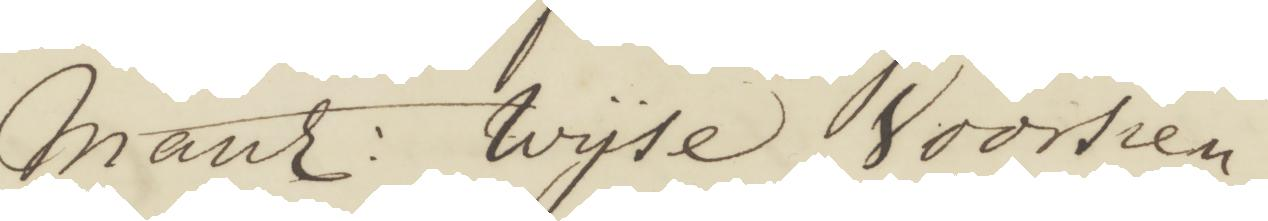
manh: wijse Voorsien
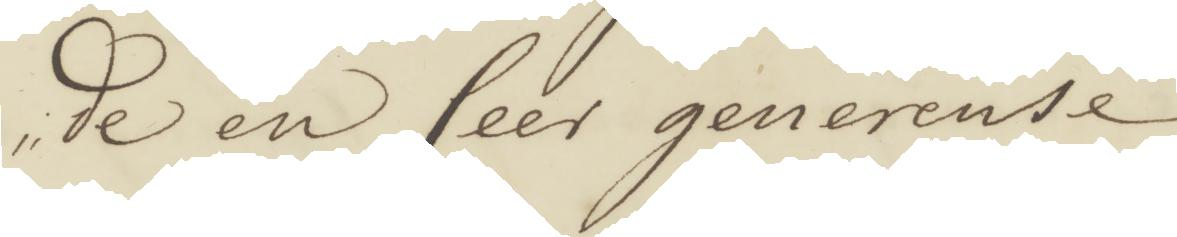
„de en seer genereuse
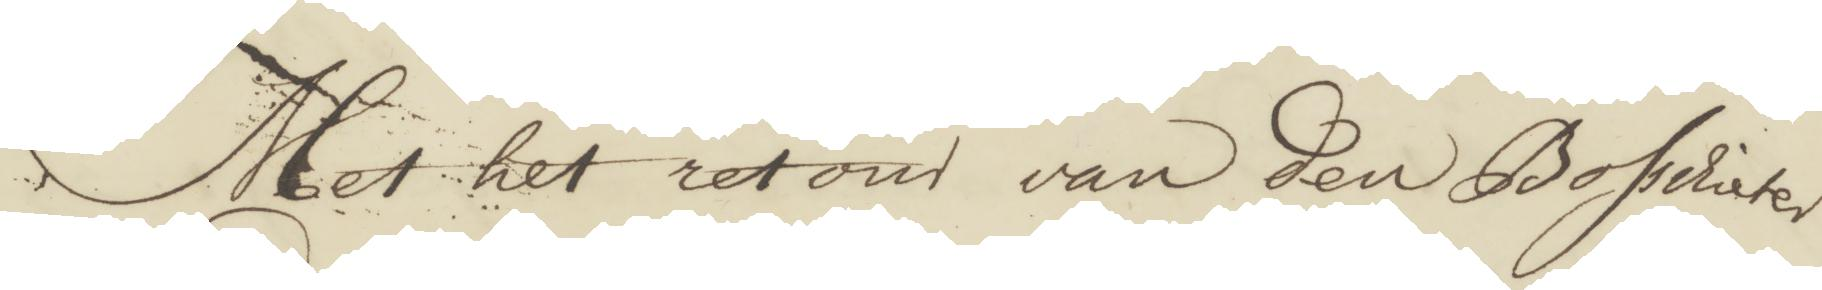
Met het retour van den Bosschieter
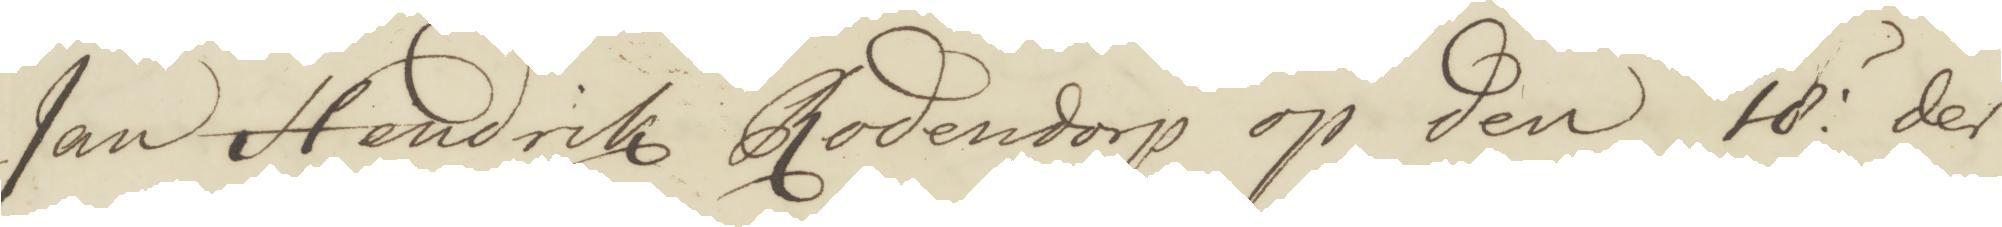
Jan Hendrik Rodendorp op den 18:' der
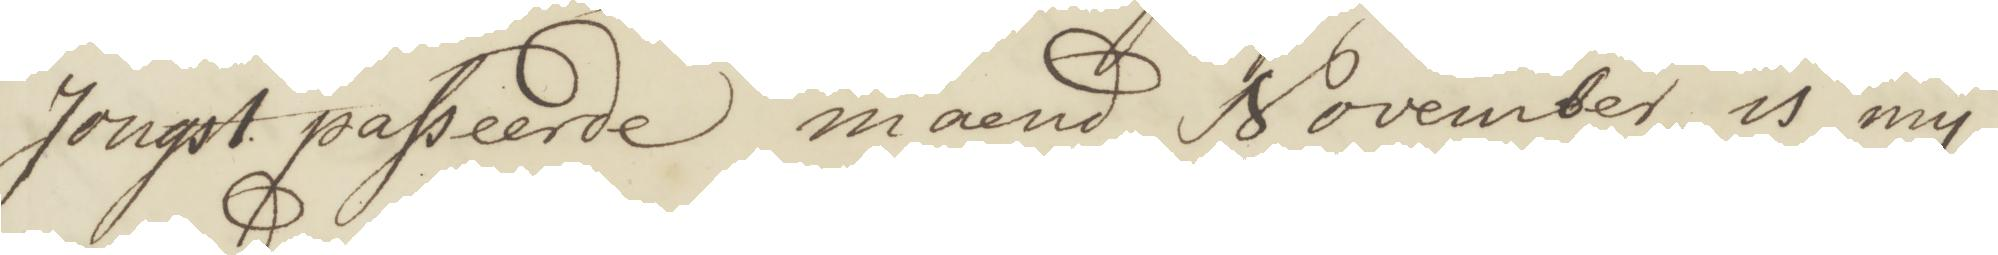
Jongst passeerde maend November is mij
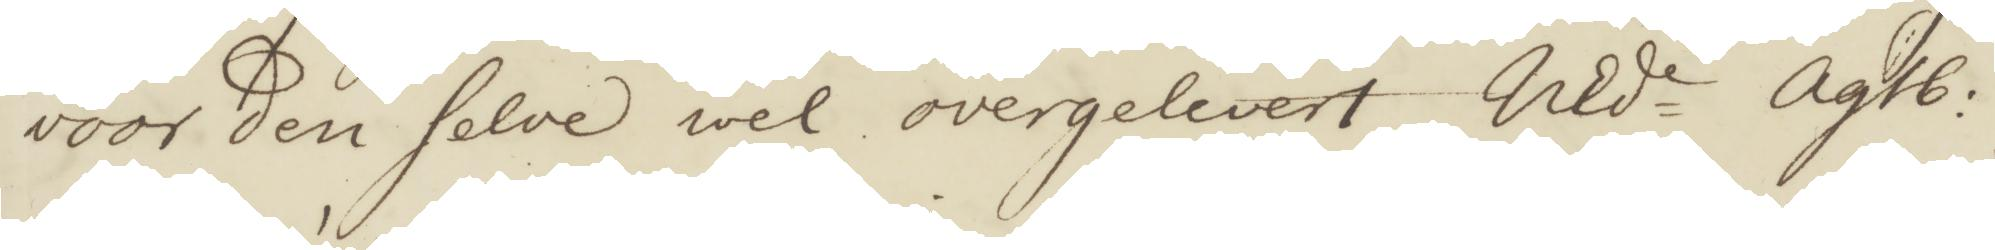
voor den selve wel overgelevert UEd=e Agtb:
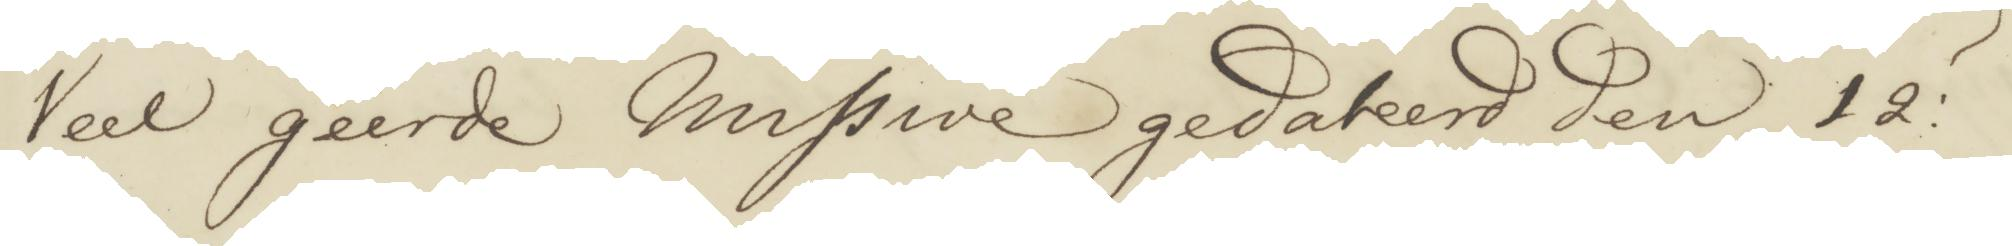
veel g'eerde missive gedateerd den 12:'
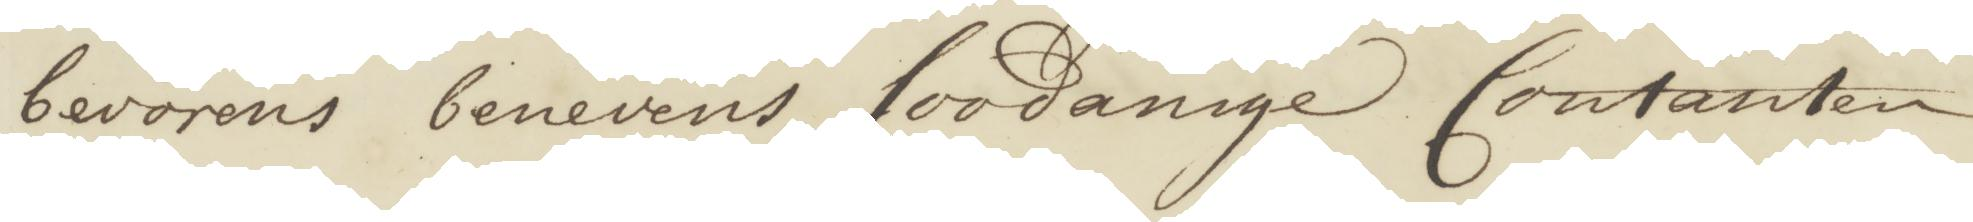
bevorens benevens soodanige Contanten
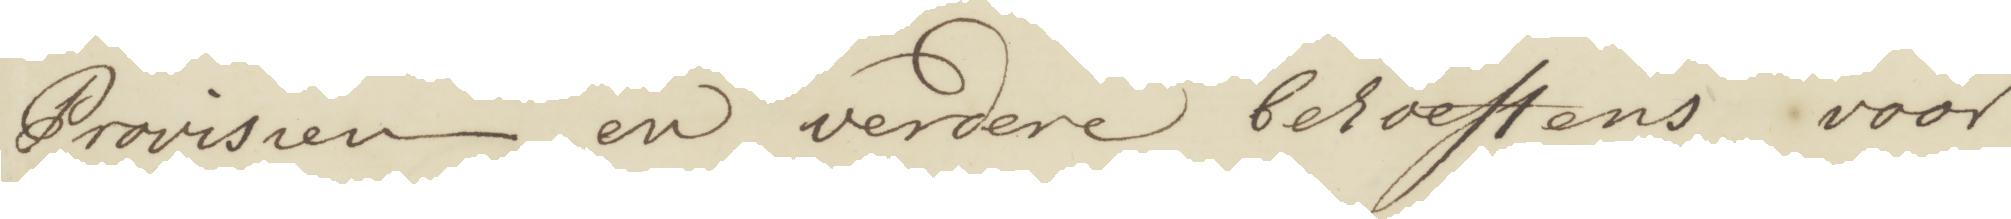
Provisien en verdere behoeftens voor
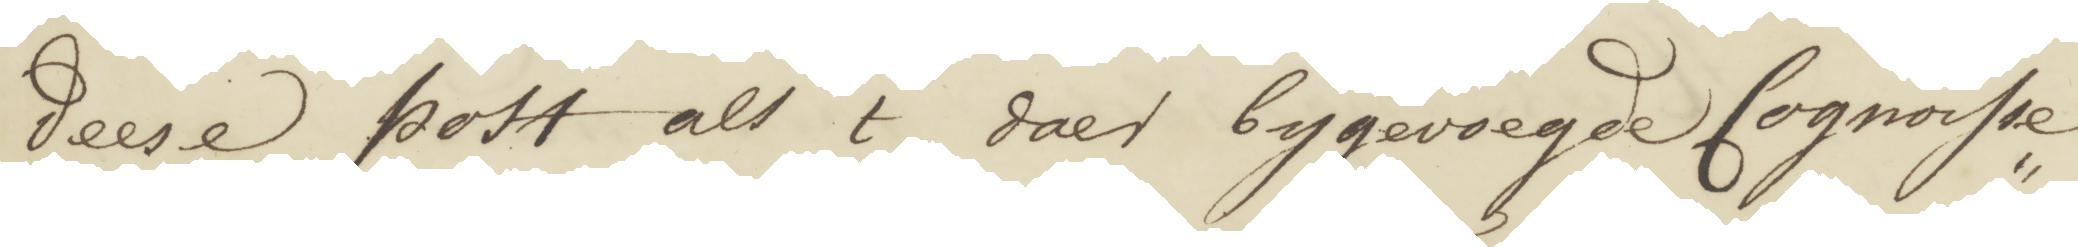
deese post als ’t daer bijgevoegde Cognoisse„
